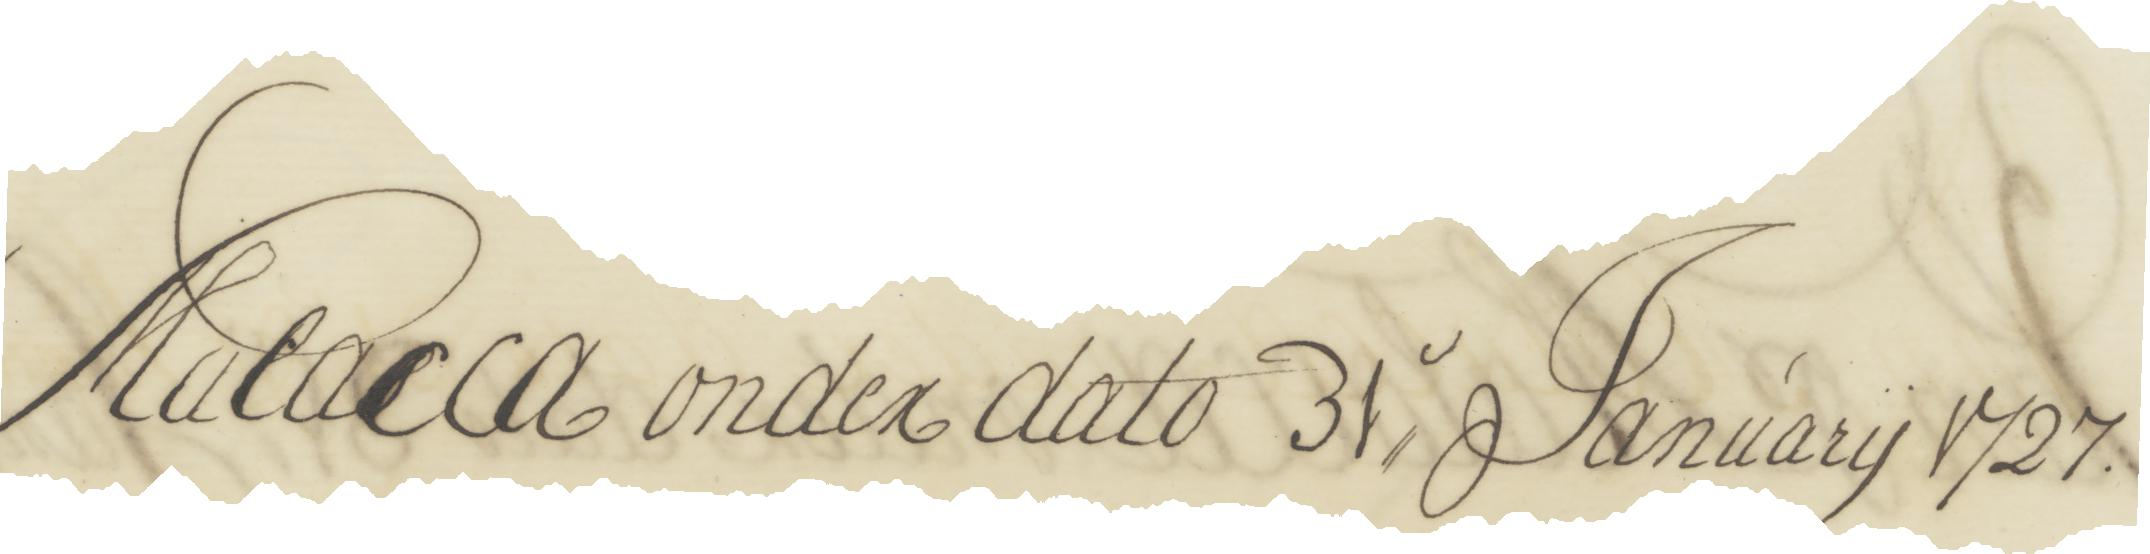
Van Malacca onder dato 31„' Januarij 1727.
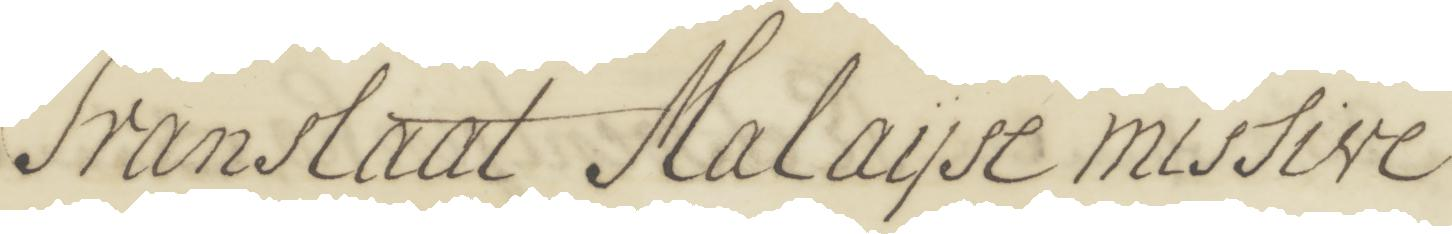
Translaat Malaijse missive
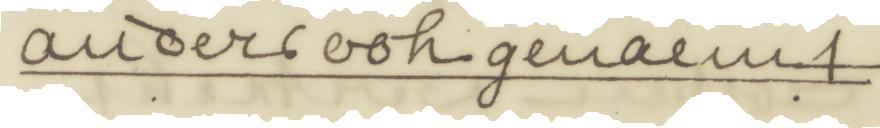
anders ook genaemt
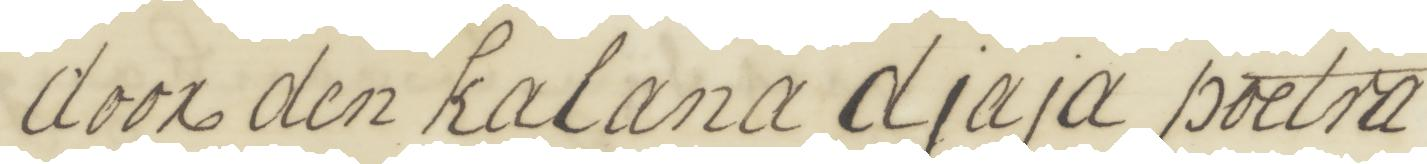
door den kalana djaja poetra
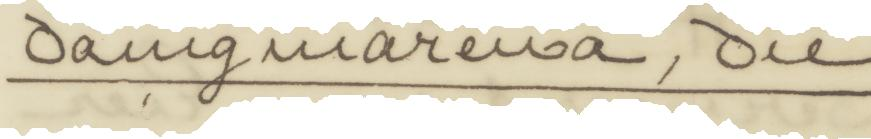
daing marewa, die
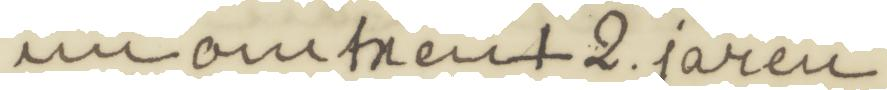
nu omtrent 2. jaren
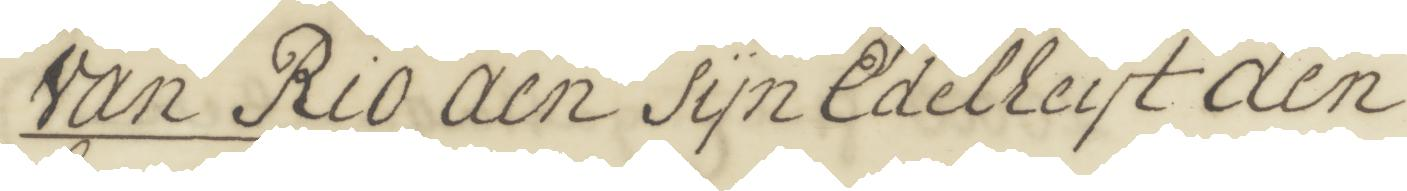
van Rio aen sijn Edelheijt den
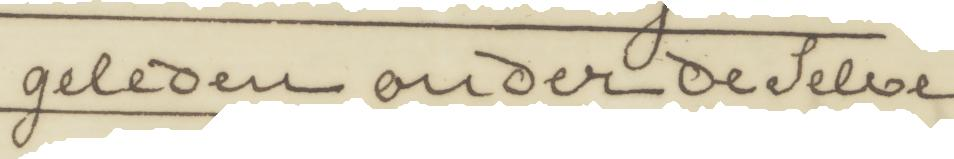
geleden onder deselve
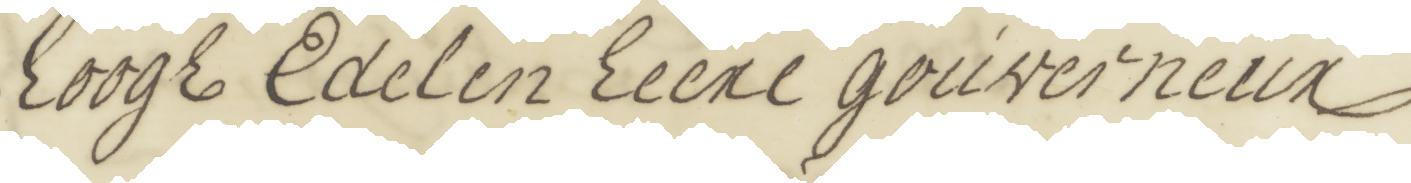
hoogh Edelen heere gouverneur
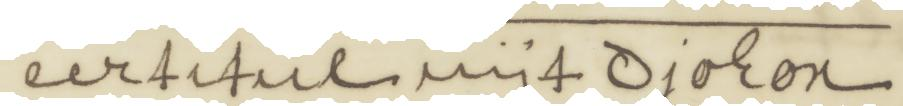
eertitul uijt djohor
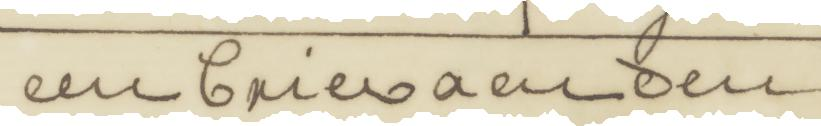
een briev aan den
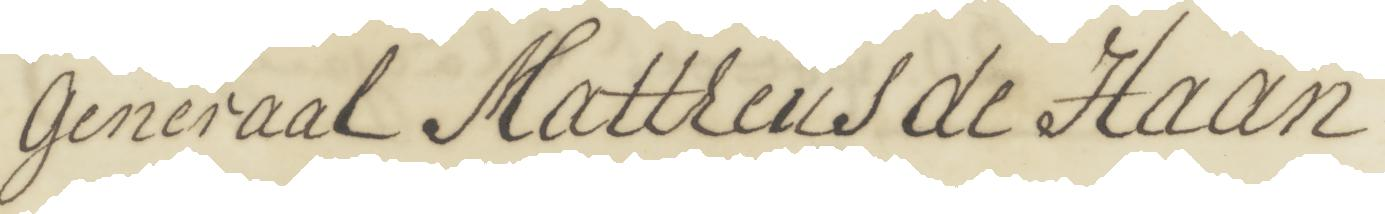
Generaal Mattheus de Haan
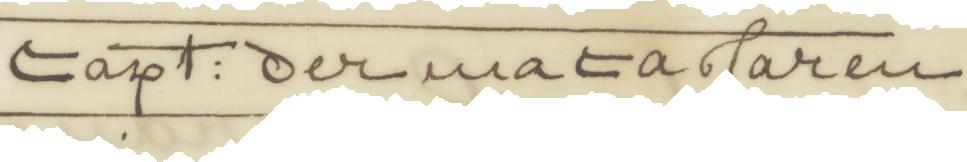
Capt: der macassaren
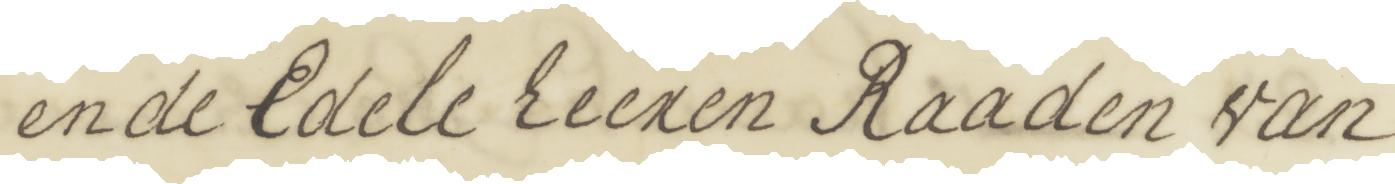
en de Edele heeren Raaden van
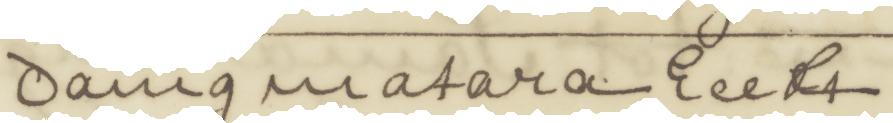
daing matara, heeft
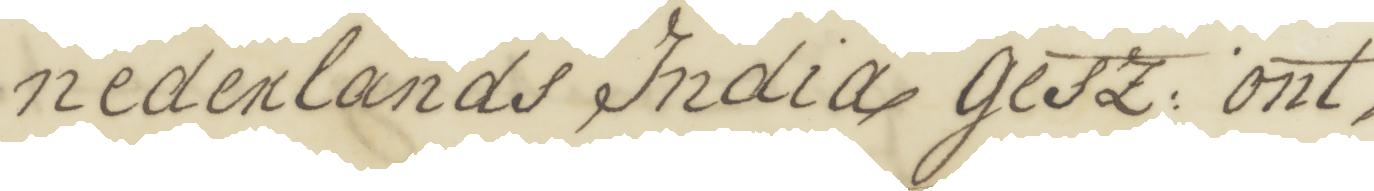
nederlands Jndia gesz: ont„
